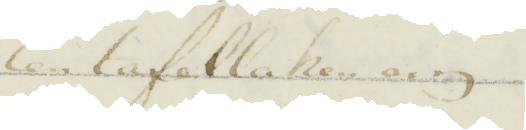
Een tafellaken enz
